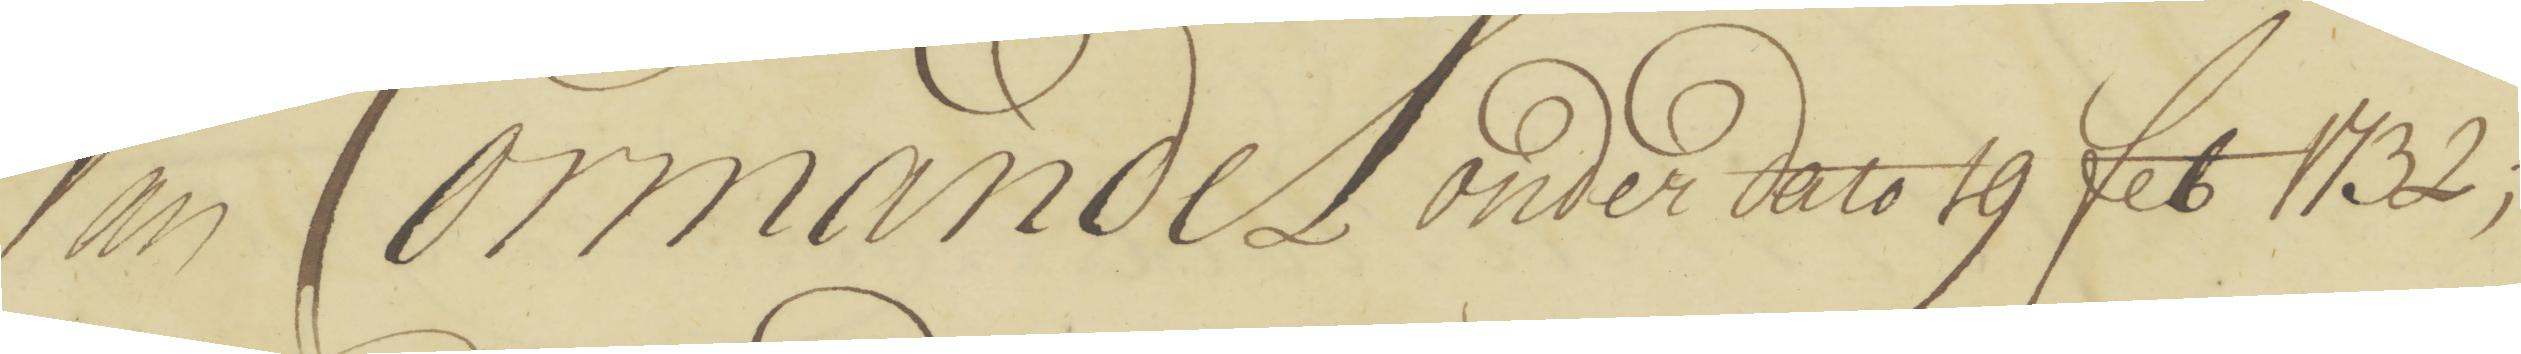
Van Cormandel onder dato 19 feb 1732;
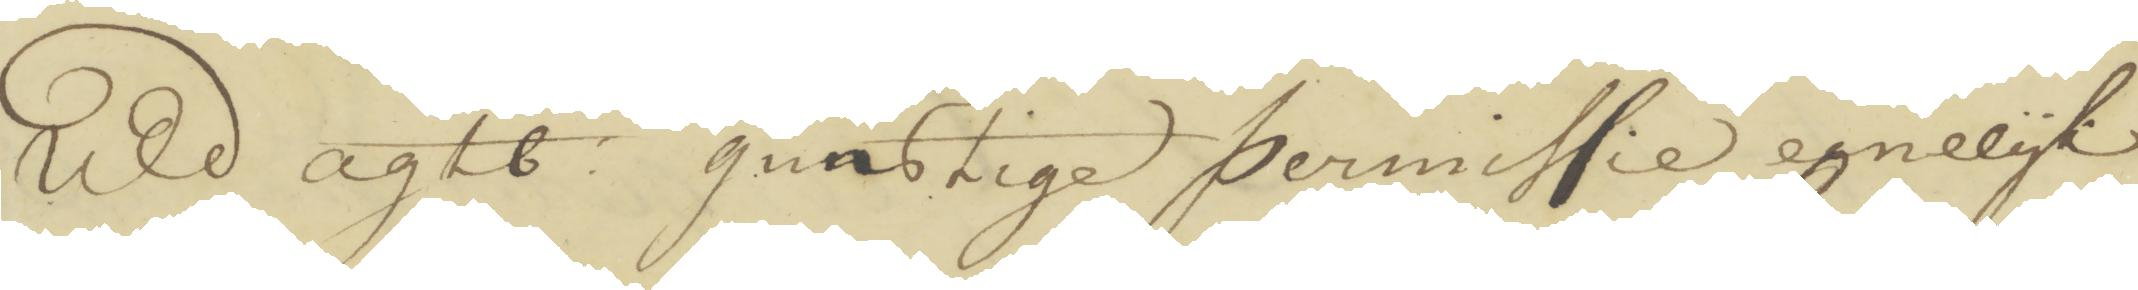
uEd agtb: gunstige permissie eenelijk
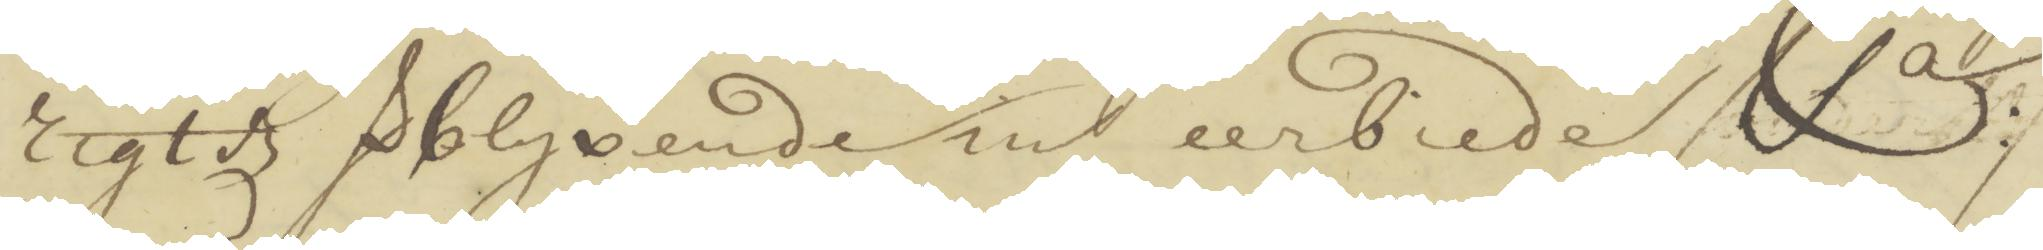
rigten verblyvende in eerbiede /&a:/
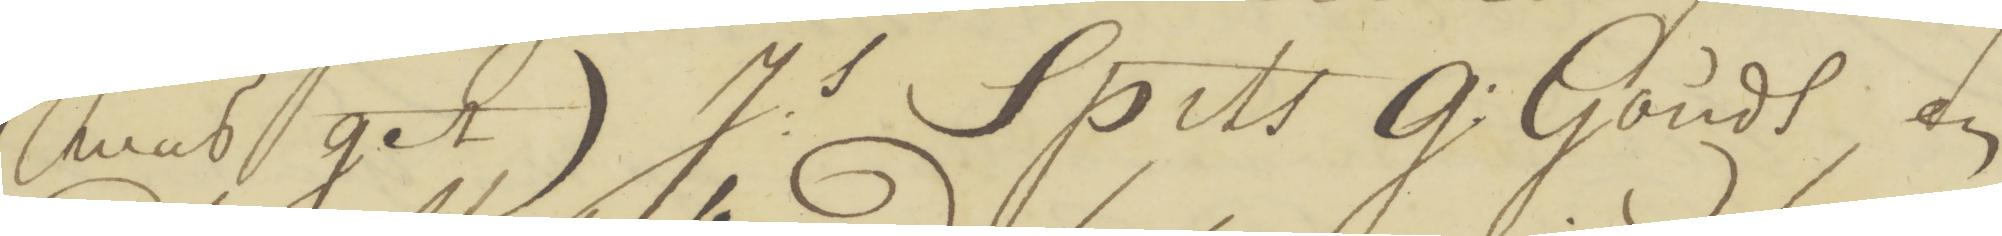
(was get) J:s Spits g: Gouds en
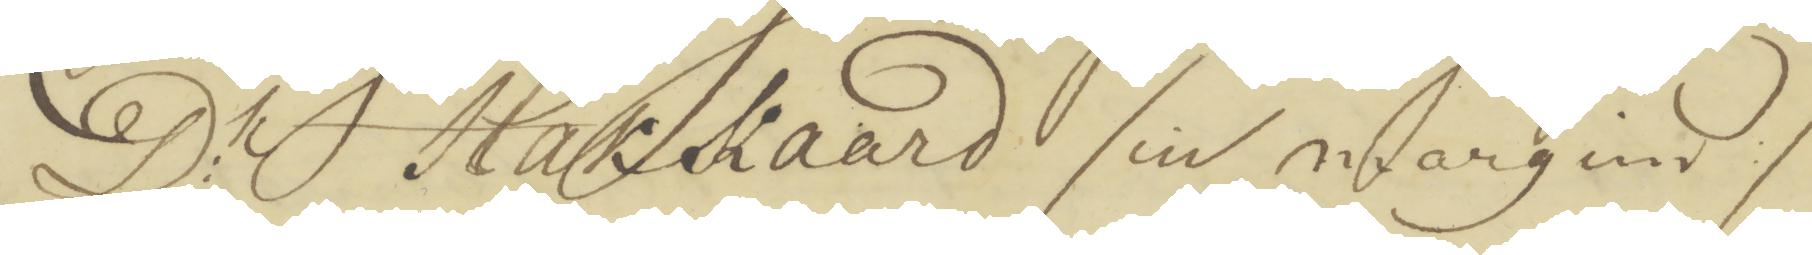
D:k Hakkaard /in margine:/
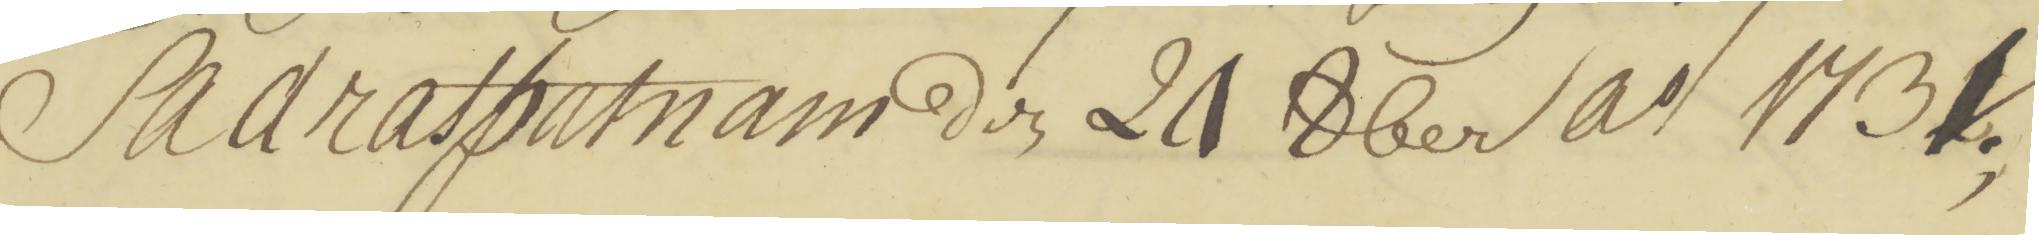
Sadraspatnam den 24 8ber ao 1731;
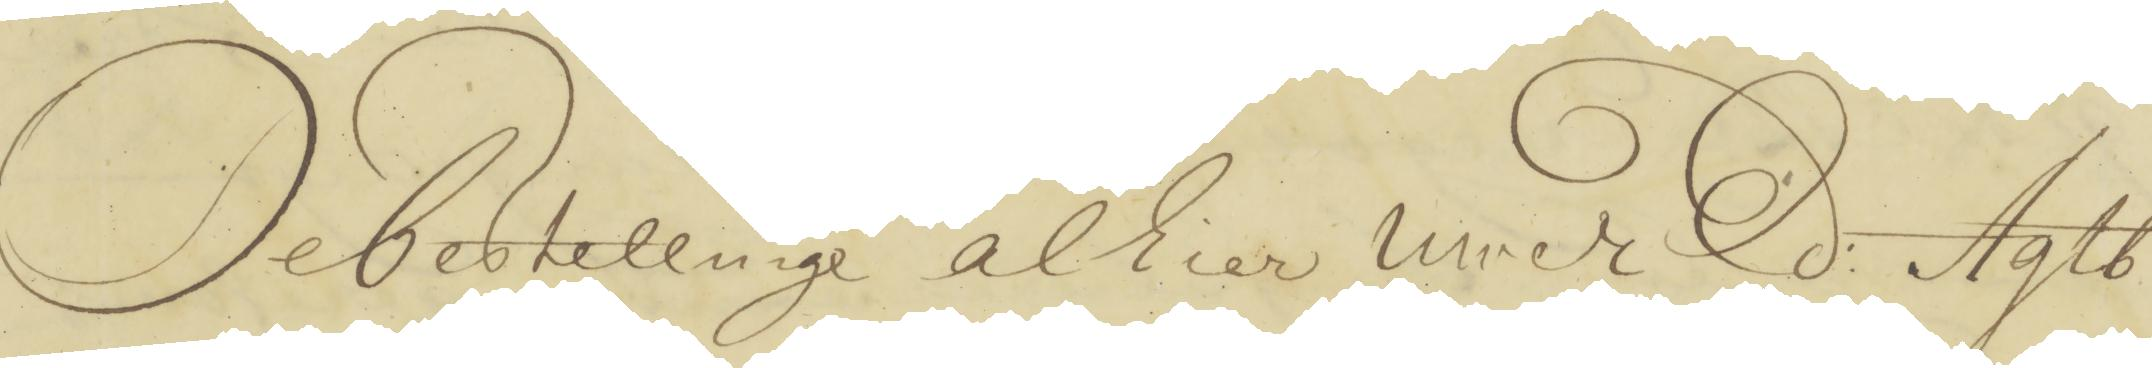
De bestellinge alhier uwer Ed: Agtb
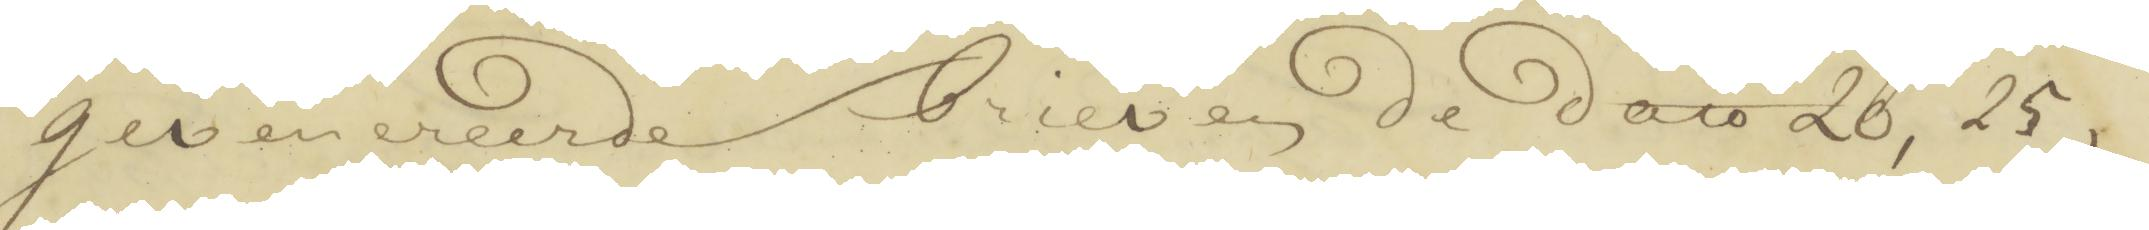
gevenereerde brieven de dato 20, 25,
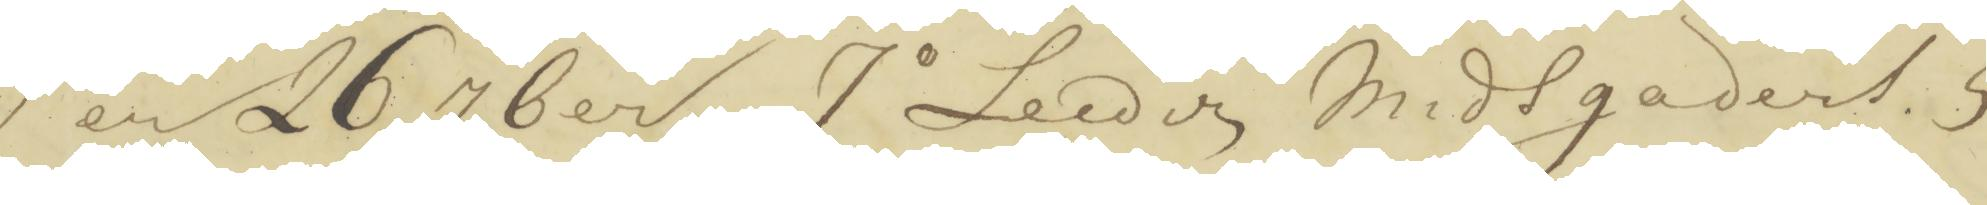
en 26 7ber Jo Leeden midsgaders. 5
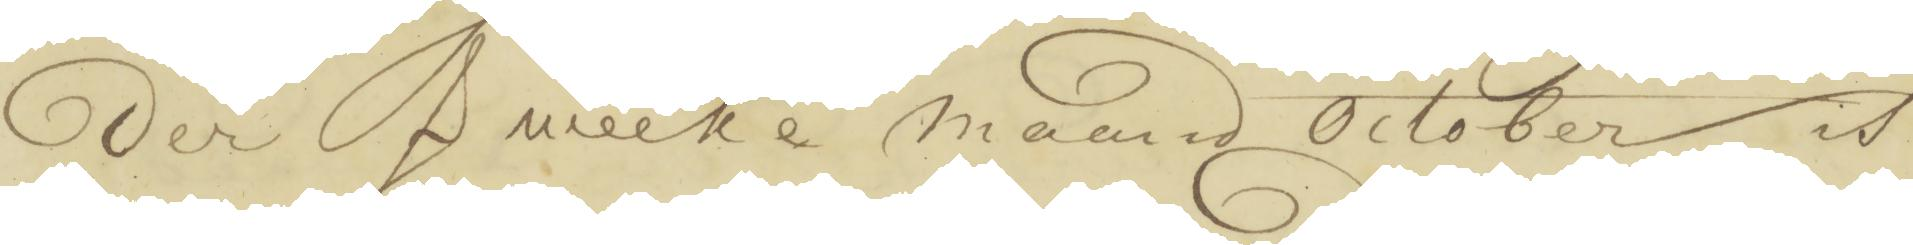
der verweeke maand October is
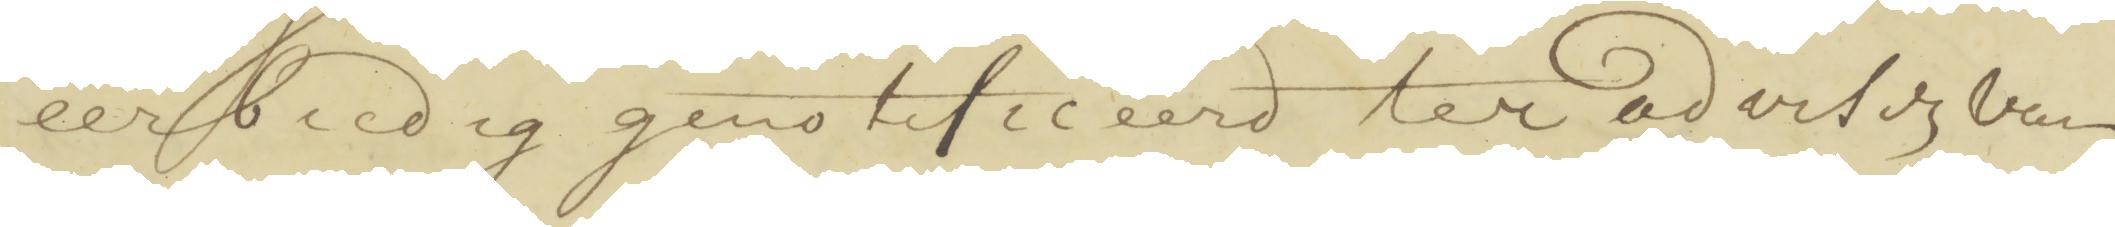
eerbiedig genotificeerd ter advisen van
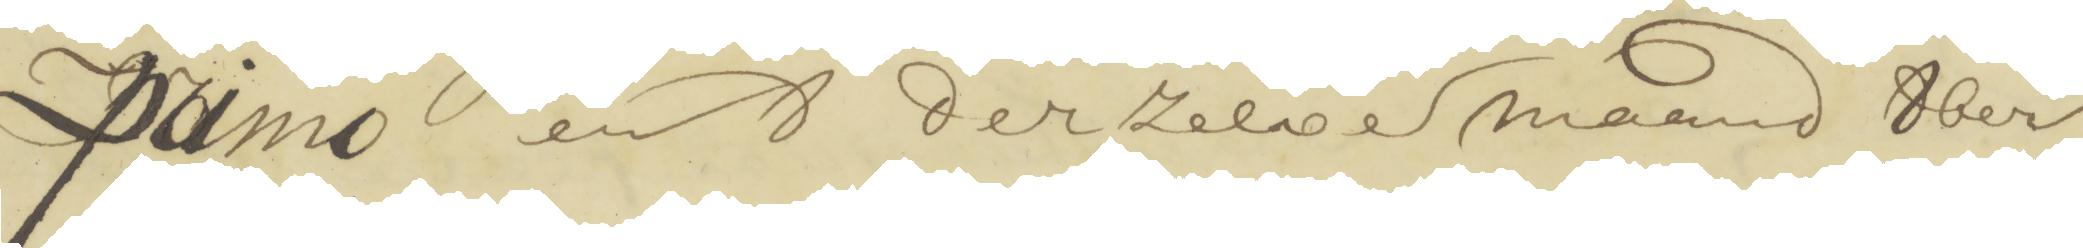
primo en 8 derzelve maand 8ber
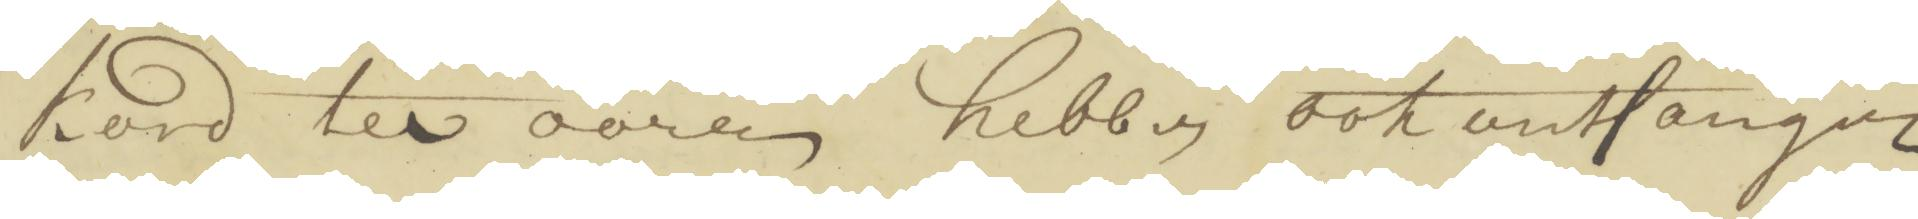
kord tevooren hebben ook ontfange
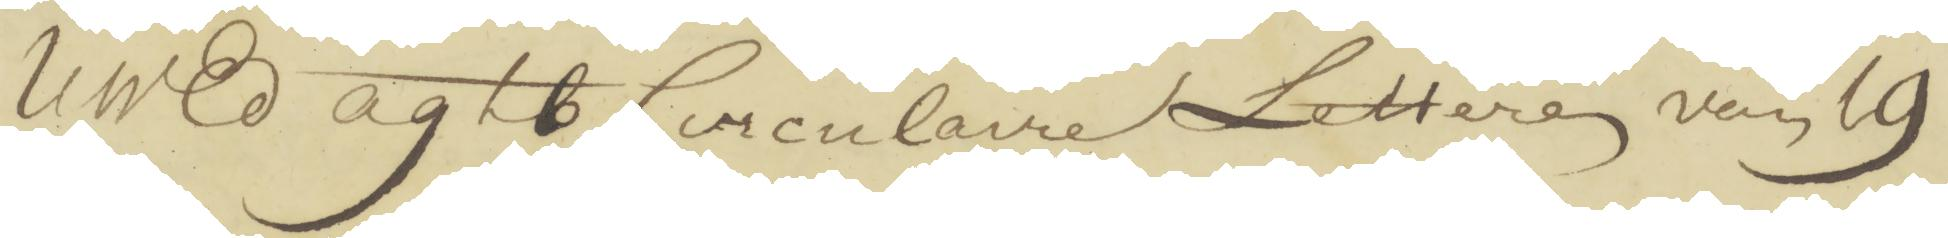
Uw Ed agtb Circulaire Letteren van 19
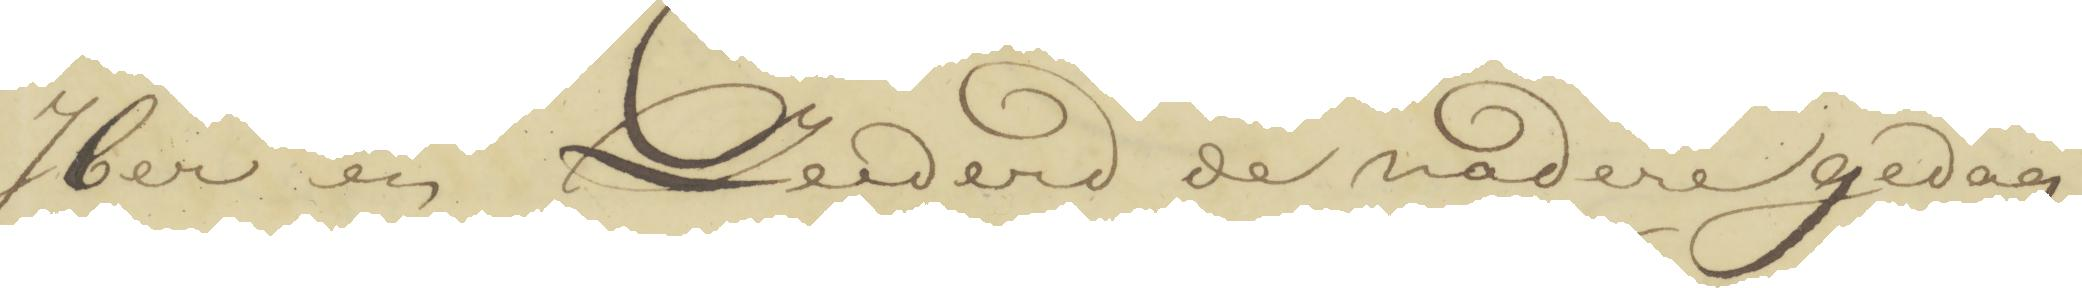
7ber en Zeederd de nadere gedag
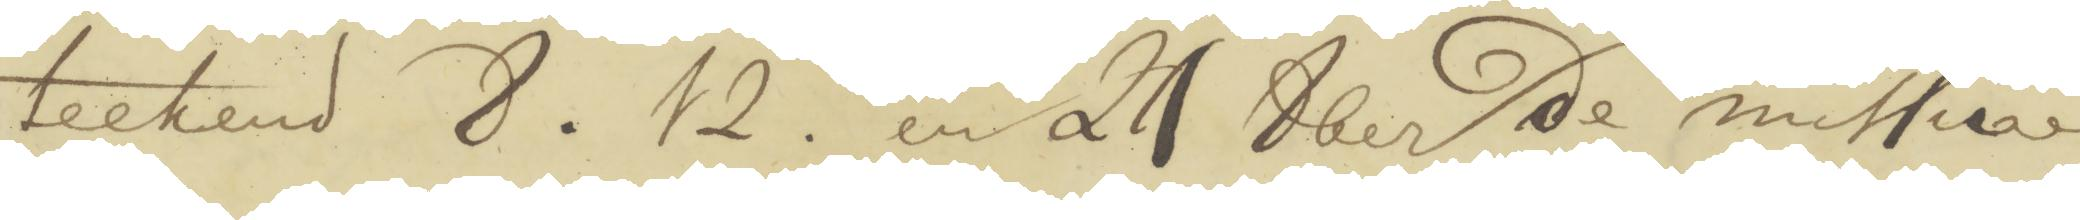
teekend 8. 12. en 24 8ber de missive
